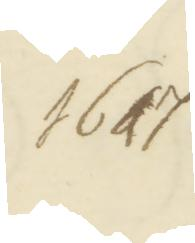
1647
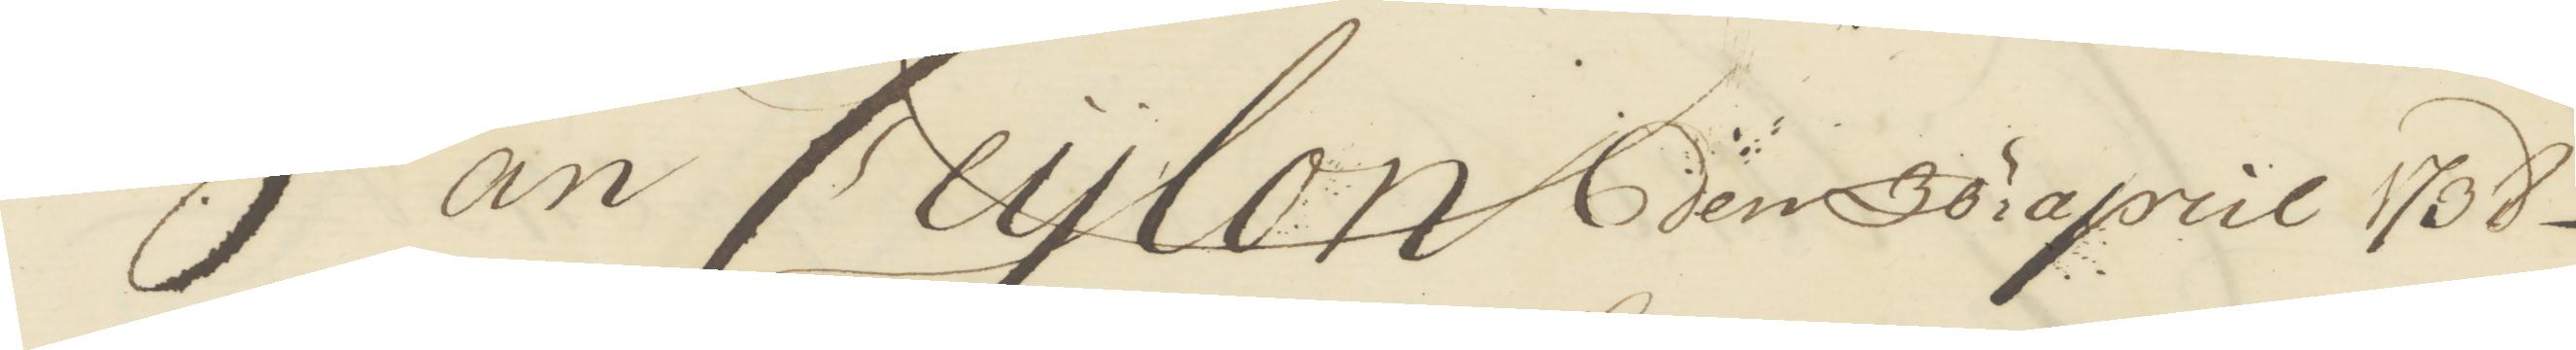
Van Ceijlon den 30: april 1738 —
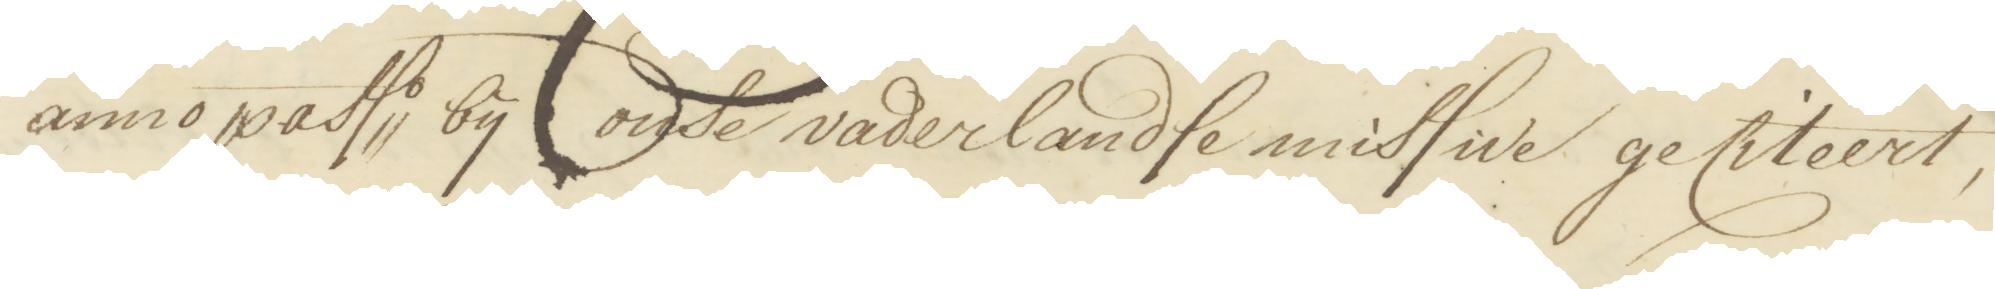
anno pass„o bij onse vaderlandse missive geciteert,
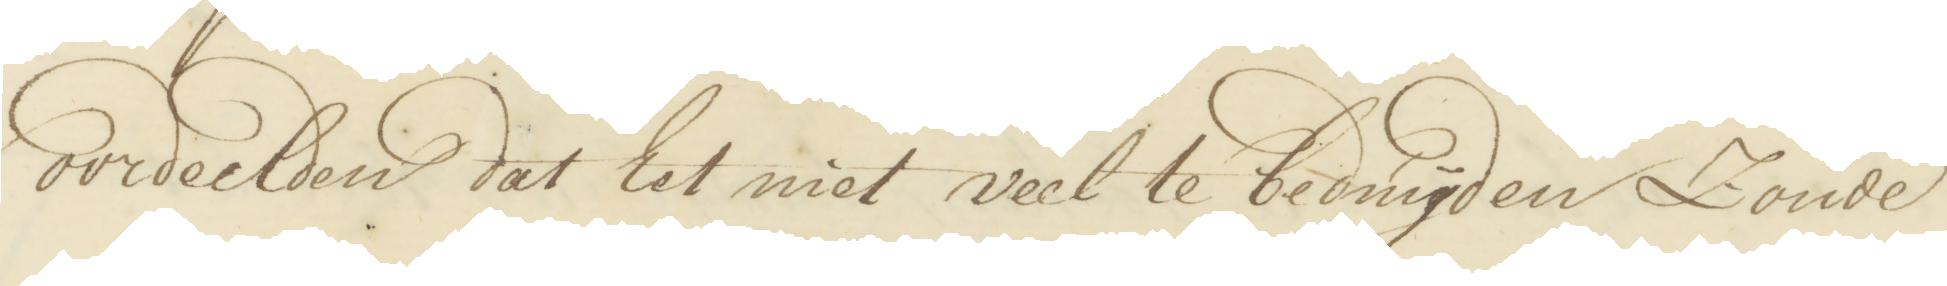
oordeelden dat het niet veel te beduijden zoude
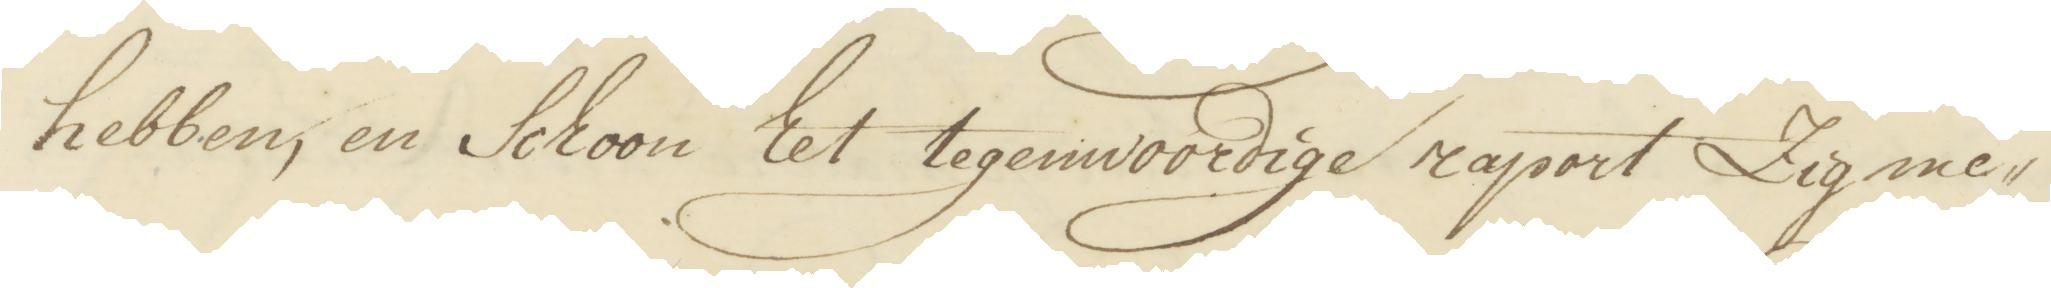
hebben, en schoon het tegenwoordige raport zig me„
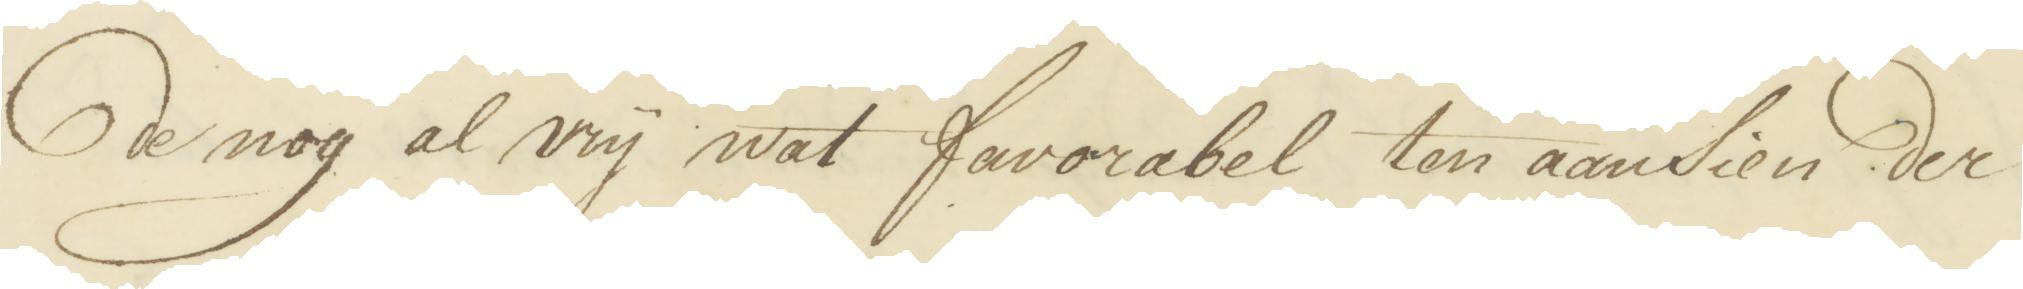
de nog al vrij wat favorabel ten aansien der
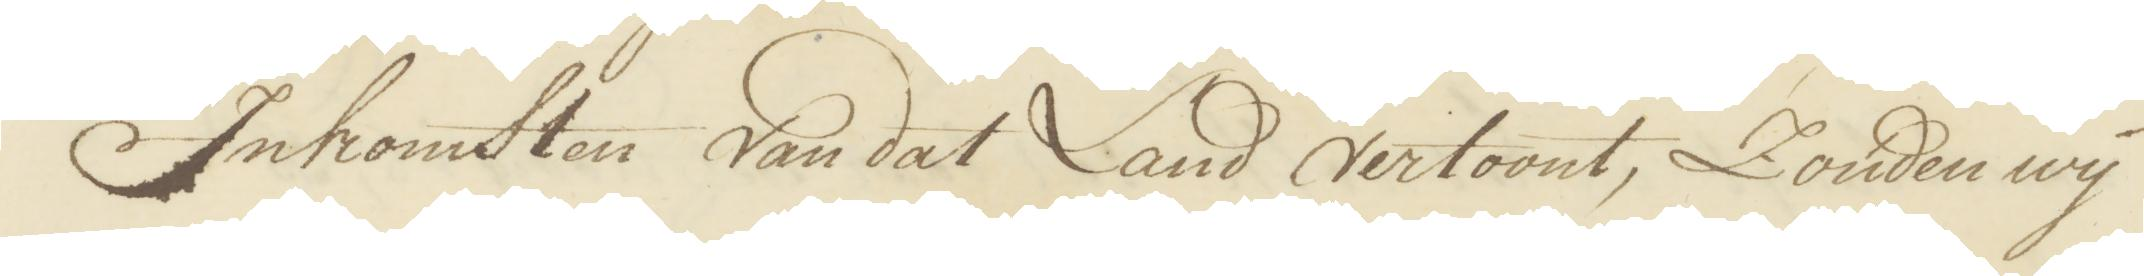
Jnkomsten van dat Land vertoont, zouden wij
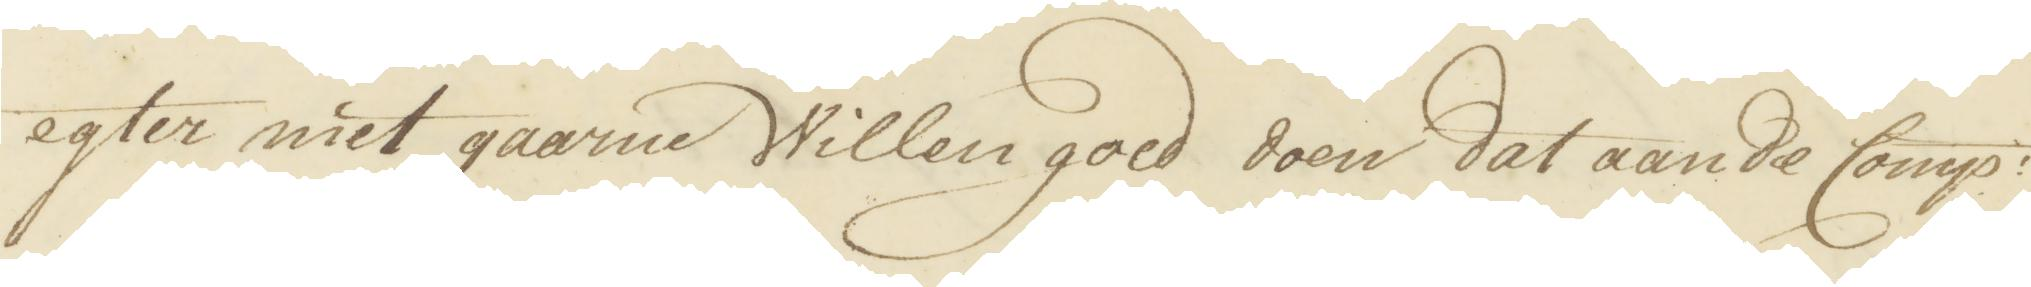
egter niet gaarne Willen goed doen dat aan de Comp:
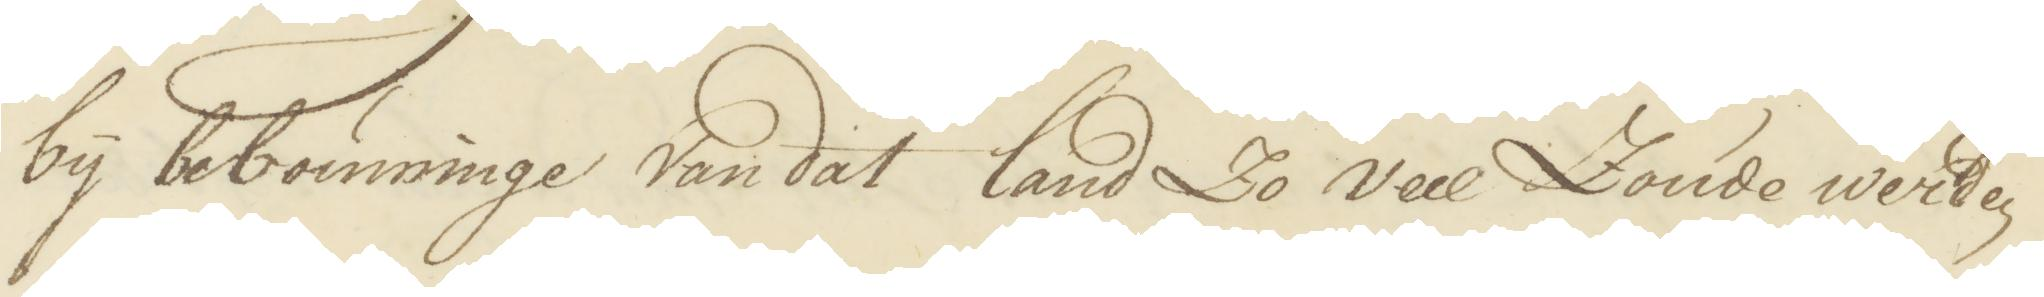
bij bebouwinge van dat land zo veel zoude werden
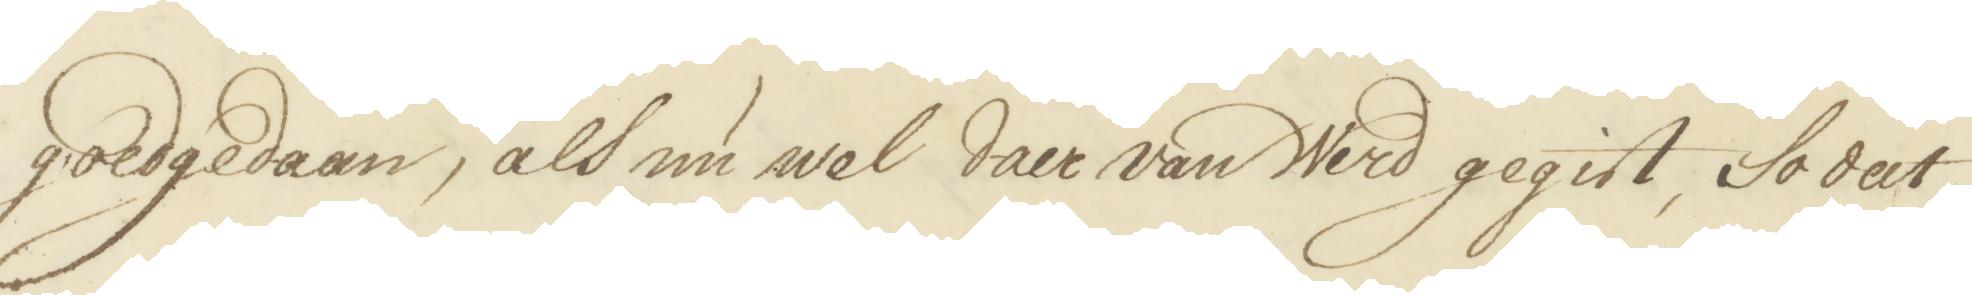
goedgedaan, als nu wel daer van Werd gegist, so dat
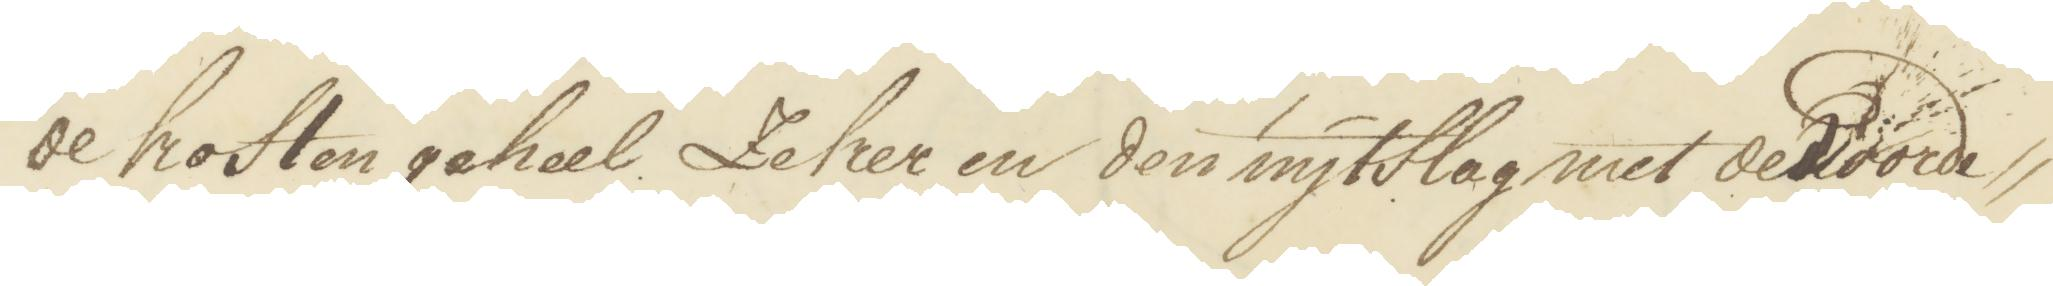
de kosten geheel zeker en den uijtslag met deVoorde„
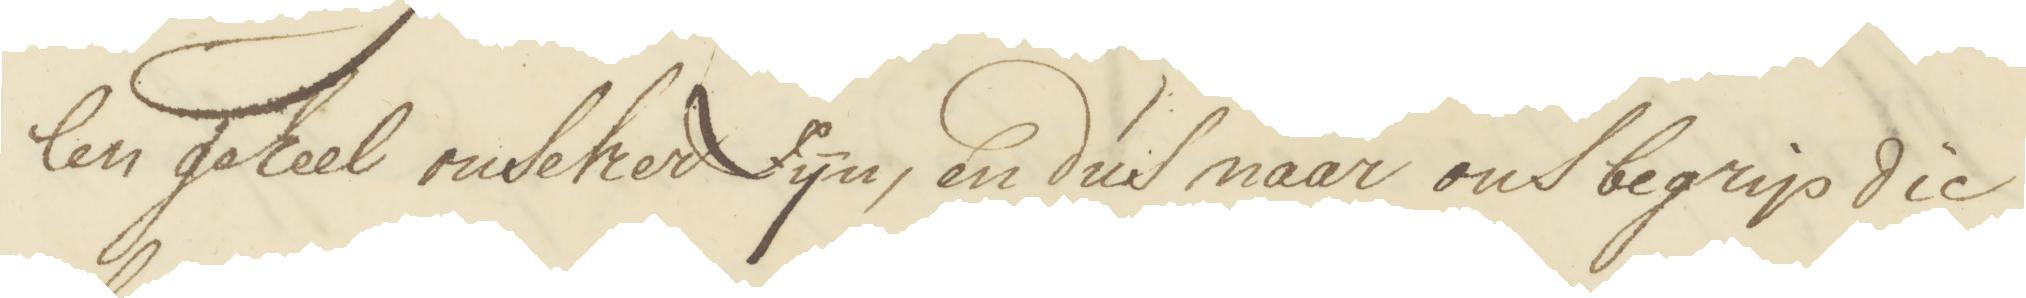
len geheel onseker zijn, en dus naar ons begrip die
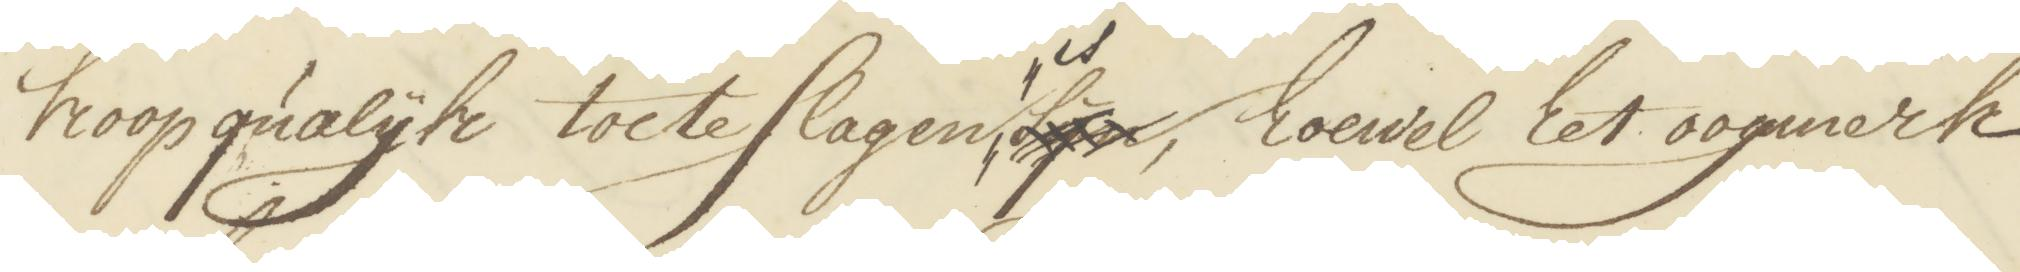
koop qualijk toete slagen „„is sijn, hoewel het oogmerk
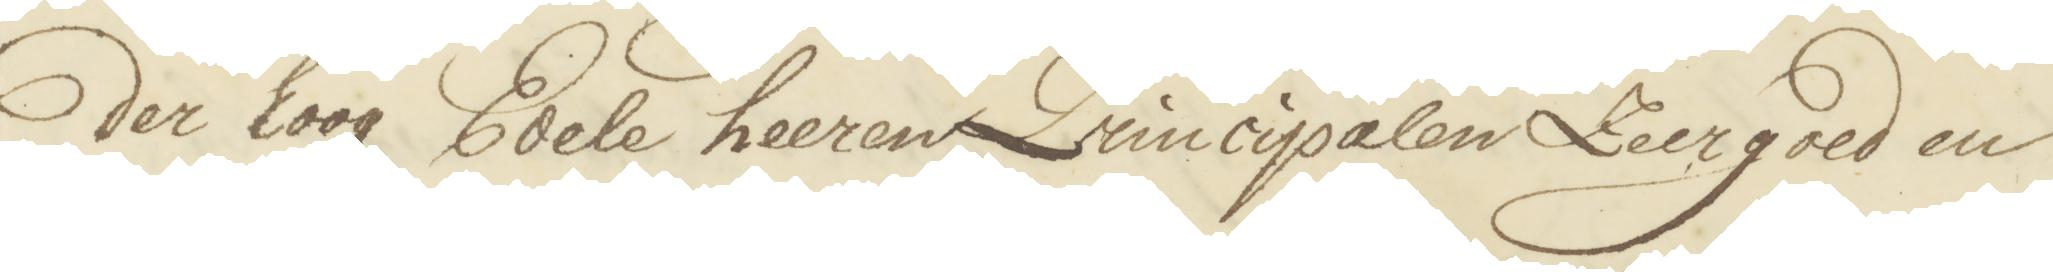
der hoog Edele heeren Principalen zeer goed en
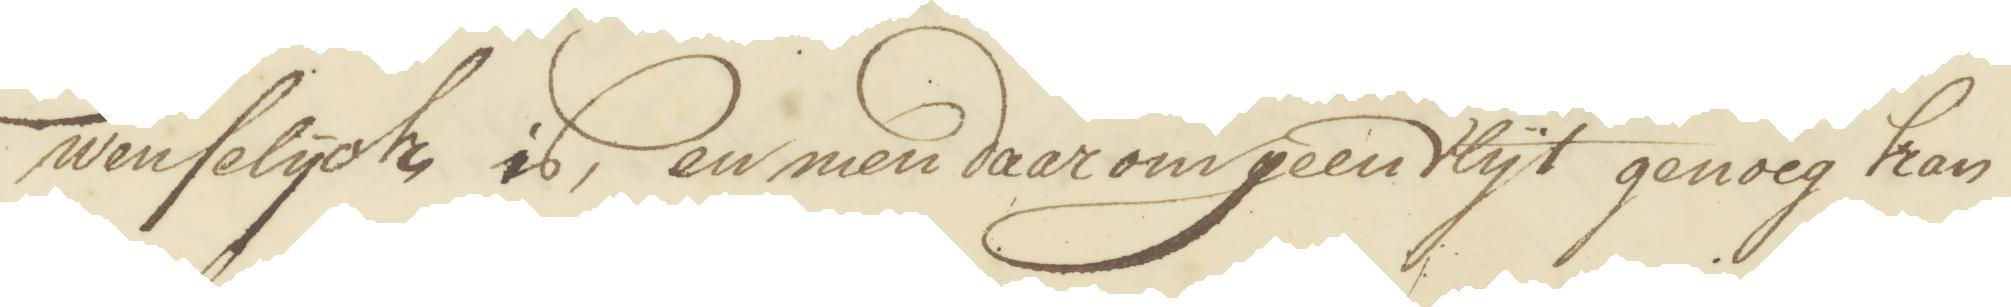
wenselijck is, en men daar om geen Vlijt genoeg kan
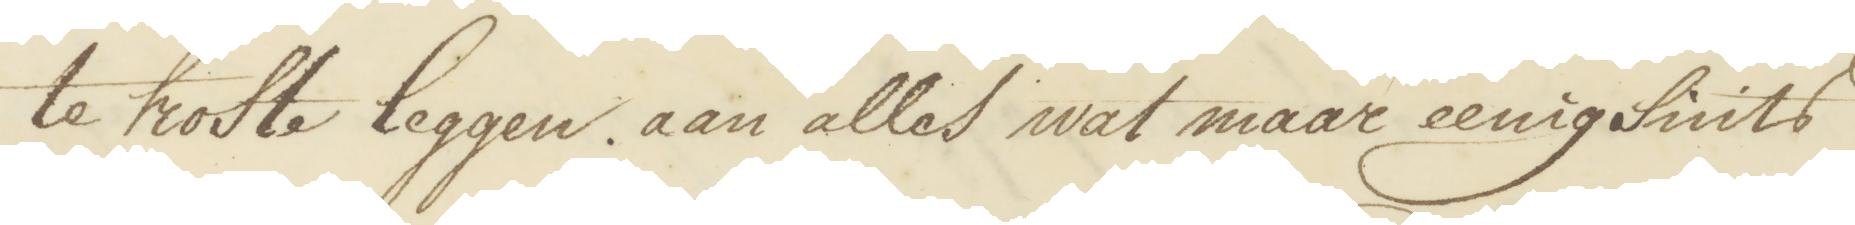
te koste leggen. aan alles wat maar eenig sints
